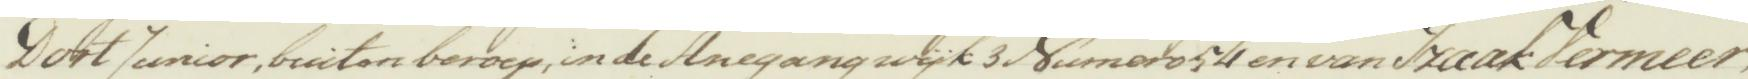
Dort Junior, buiten beroep, in de Anegang wijk 3 Numero 54 en van Izaak Vermeer
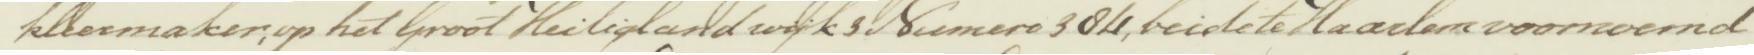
kleermaker, op het Groot Heiligland wijk 3 Numero 384, beide te Haarlem voornoemd
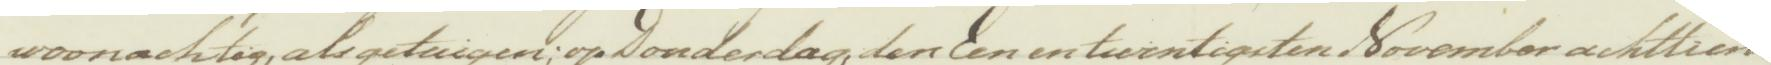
woonachtig, als getuigen; op Donderdag, den Een en twintigsten November achttien
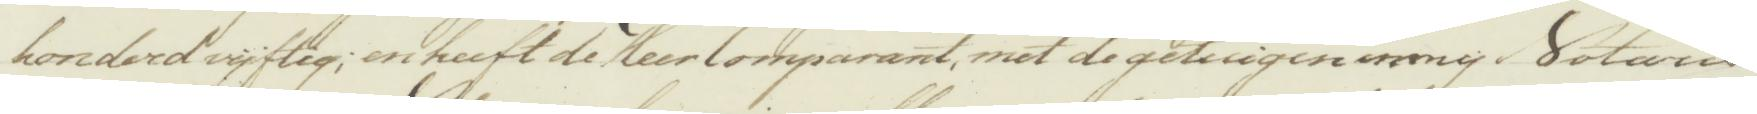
honderd vijftig; en heeft de Heer Comparant, met de getuigen en mij Notaris
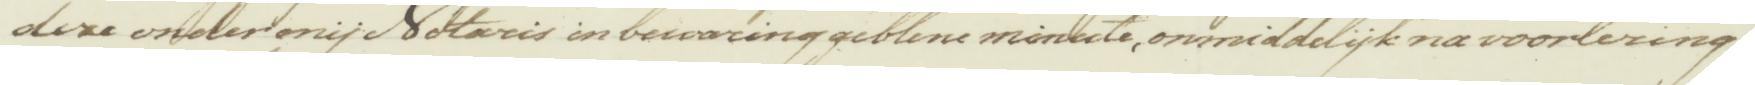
deze onder mij Notaris in bewaring gebleve minute, onmiddelijk na voorlezing,
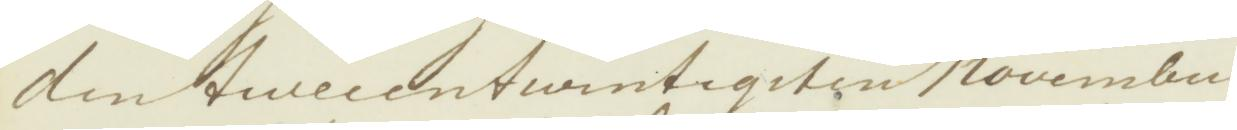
den tweeentwintigsten November
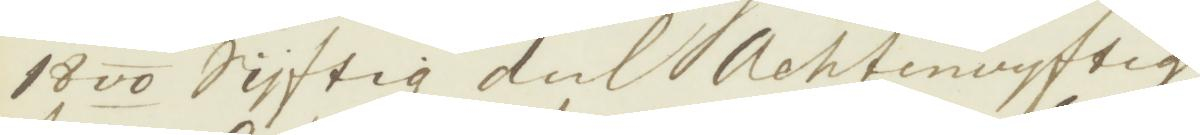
1800 vijftig deel Achtenvijftig
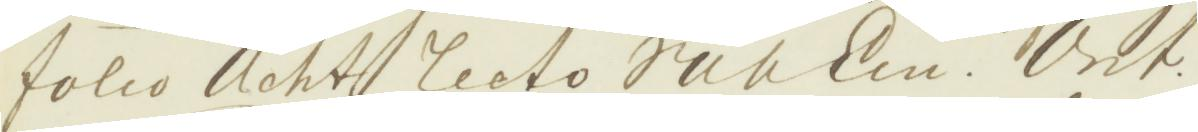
folio Acht recto vak Een. Ont.
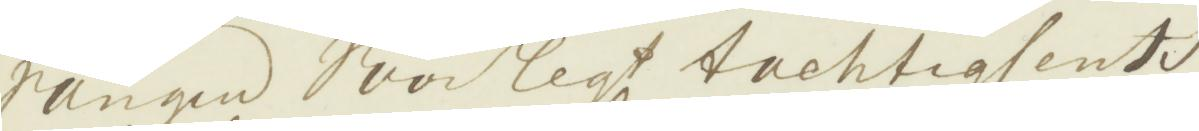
vangen voor regt tachtig Cents
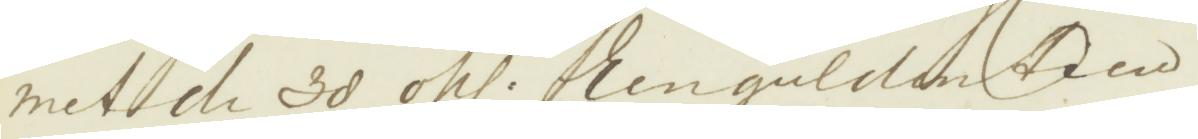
met de 38 opC: Een gulden tien
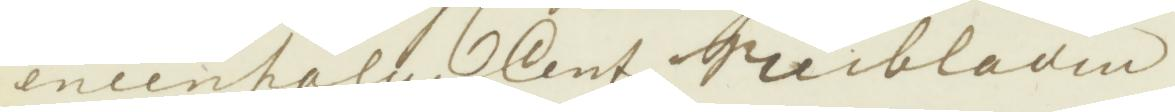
en een halve Cent Vier bladen
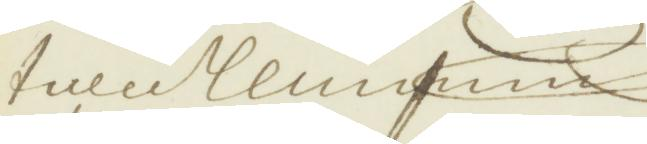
twee renvooien
